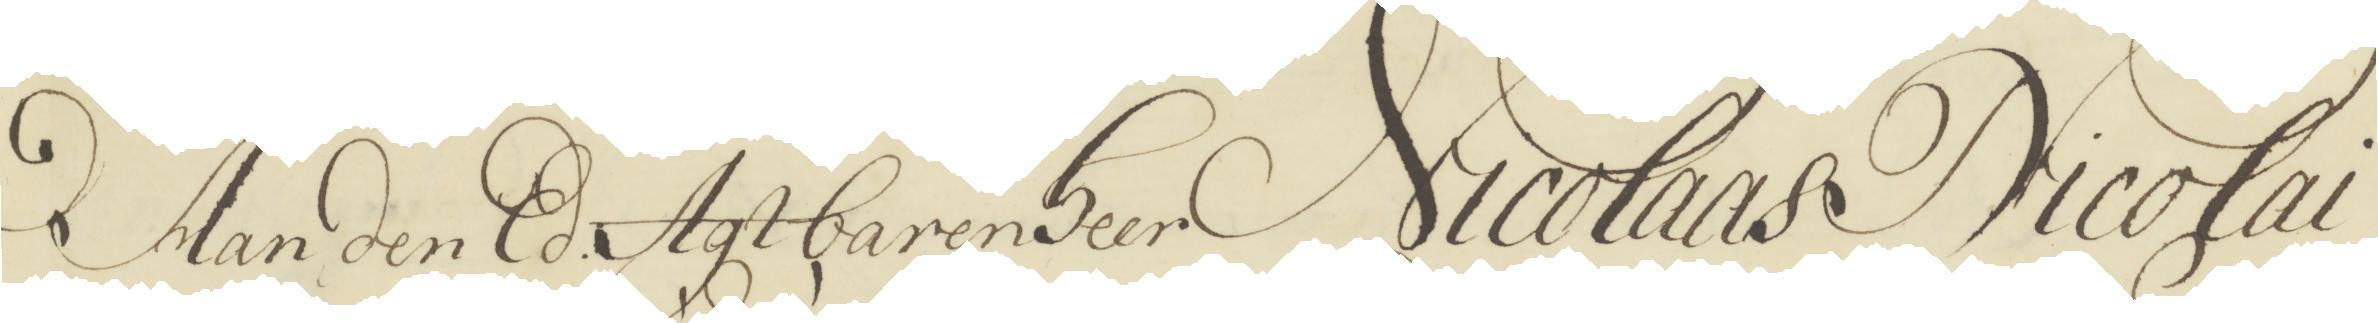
Aan den Ed: Agtbaren heer Nicolaas Nicolai
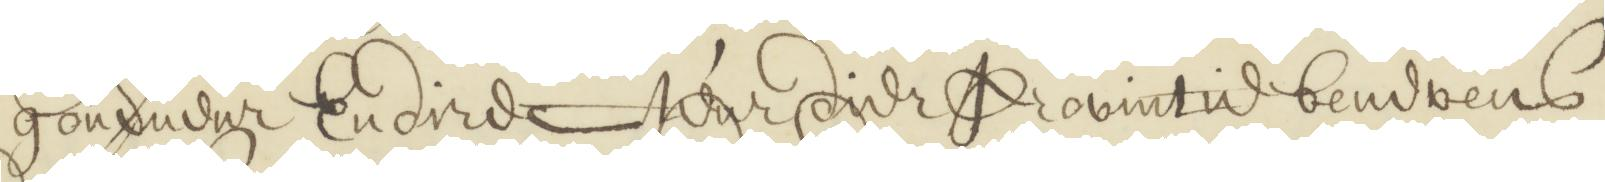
gouverneur En directeur dier Provintie benevens
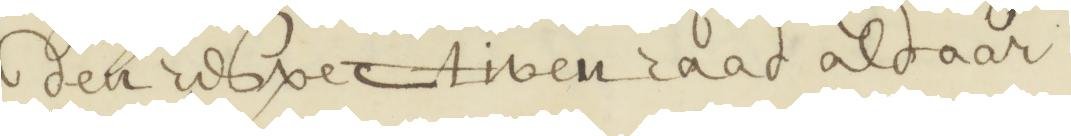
den respectiven raad aldaar
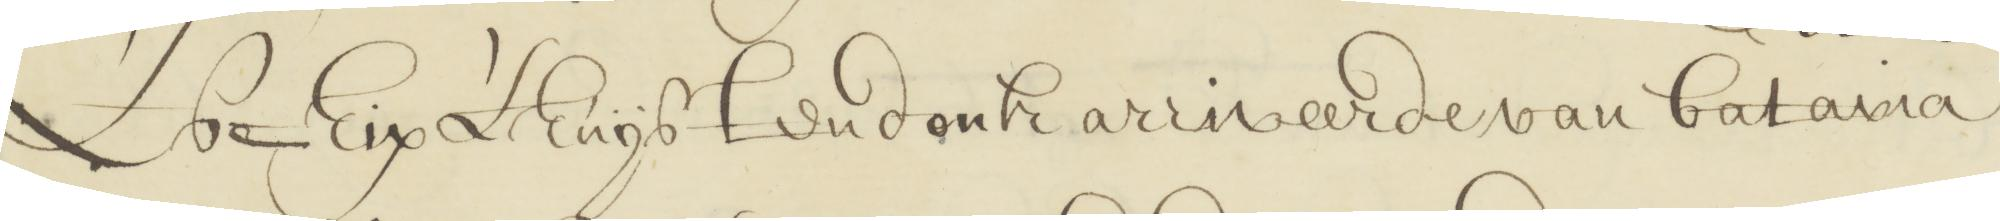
'Tschip 'thuijs ten donk arriveerde van batavia
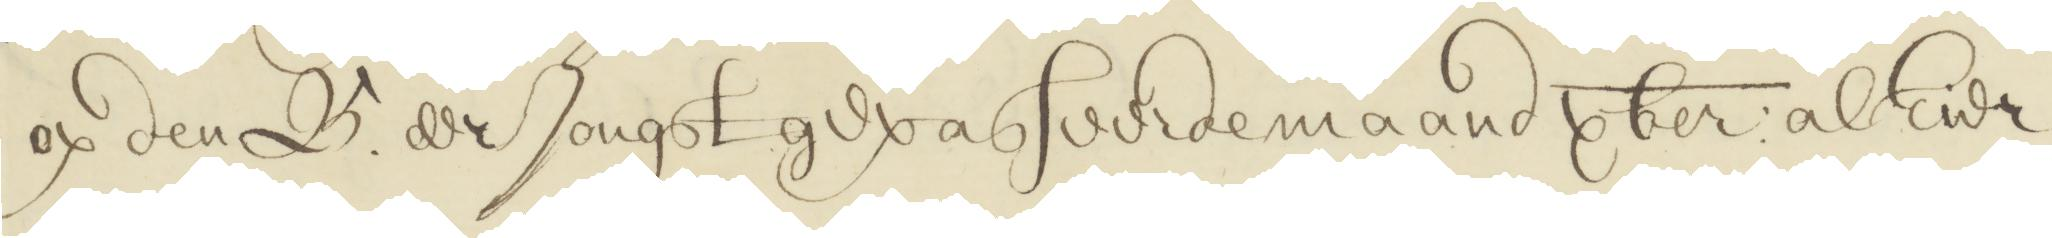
op den 25. der jongst gepasseerde maand xber: alhier
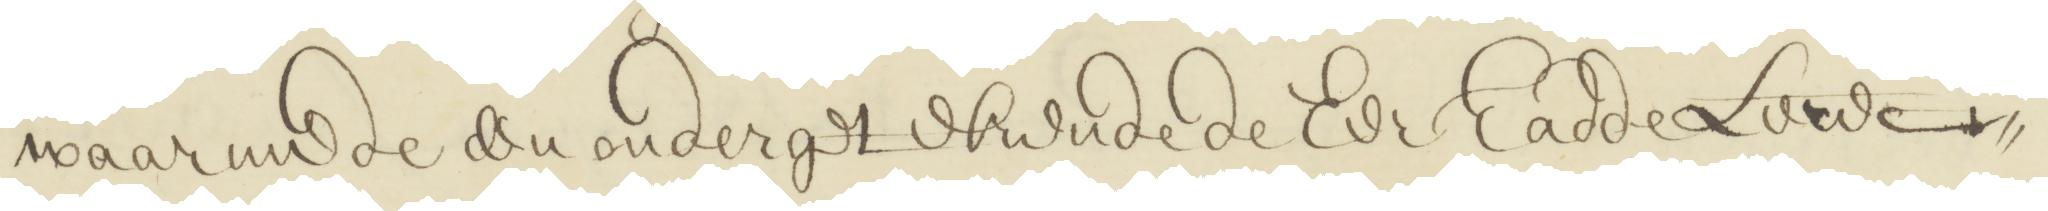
waar mede den ondergetekende de Eer hadde te reci„
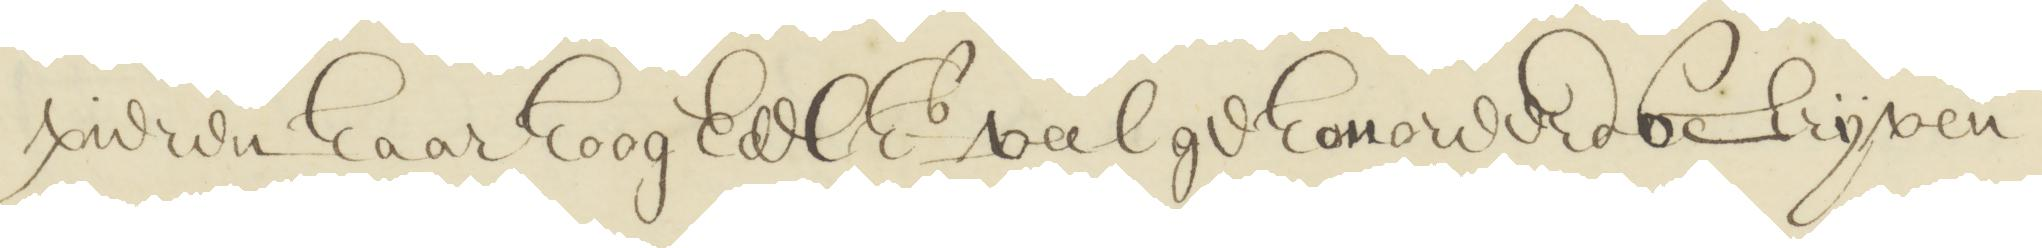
pieren haar hoog Edelh=s veel gehonoreerd schijven
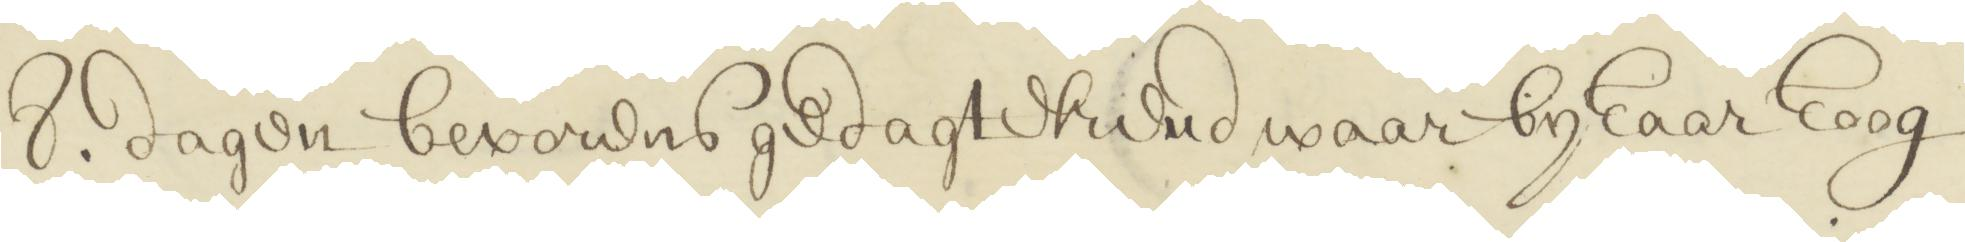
8. dagen bevorens gedagtekend waar bij haar hoog
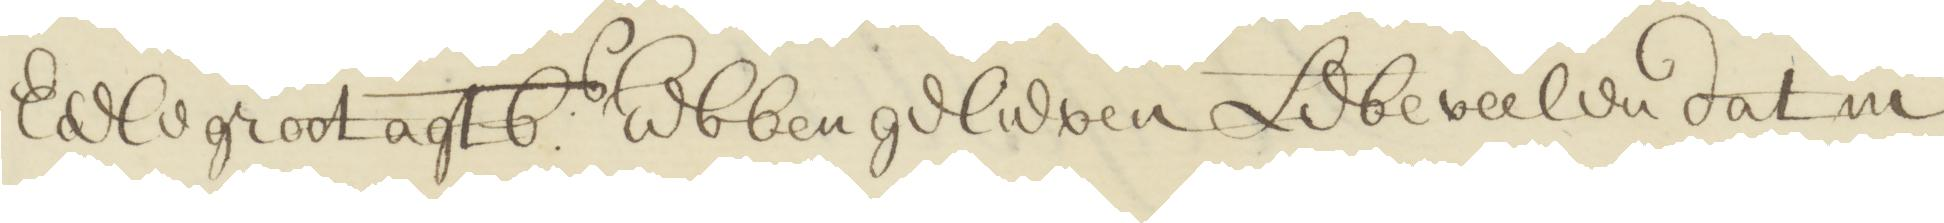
Edele groot agtb:s hebben gelieven tebeveelen dat in
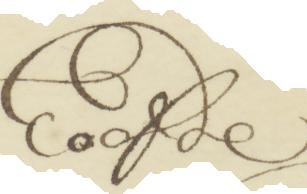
hoofde
